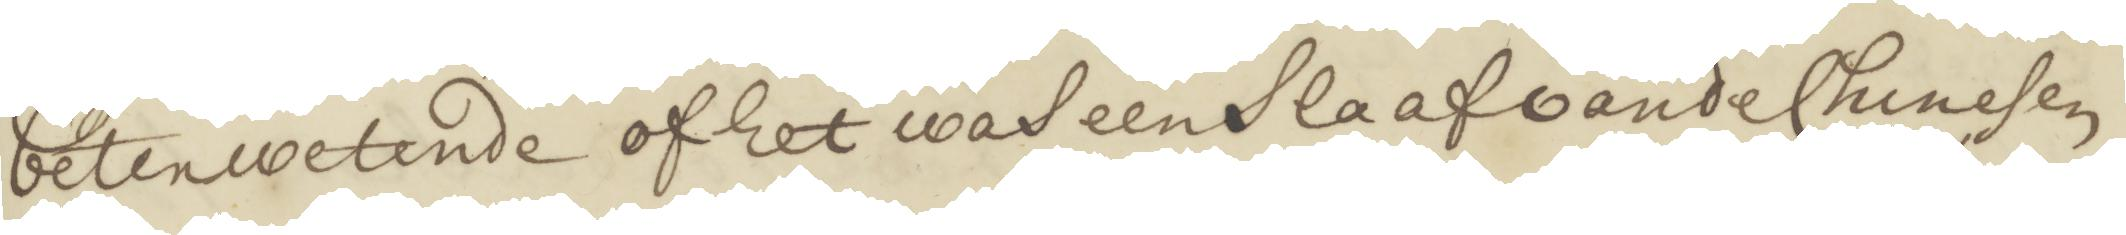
beterwetende of het was een slaaf van de Chinesen
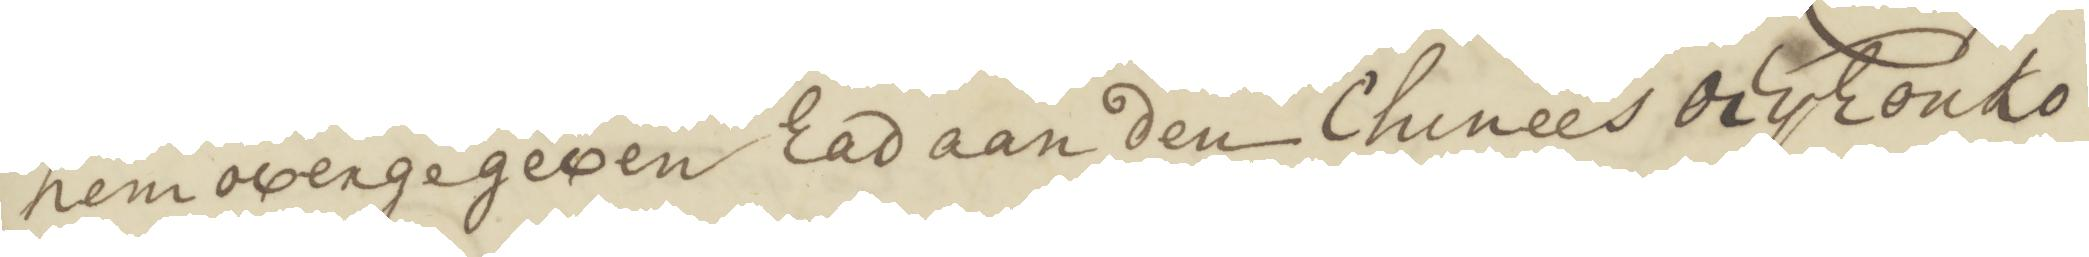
hem overgegeven had aan den Chinees Oeyhouko
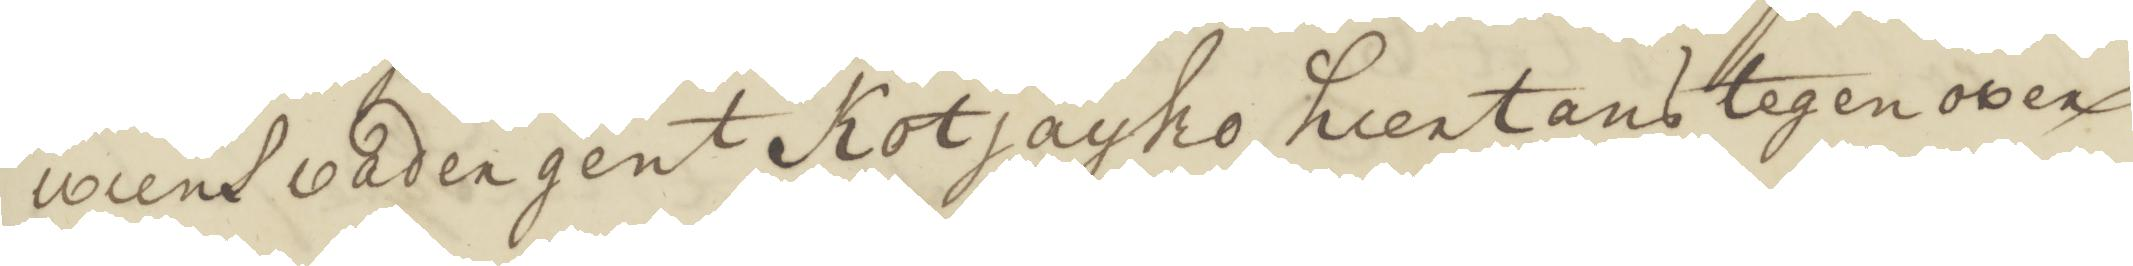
wiens vader gent Kotjayko hier tans tegen over
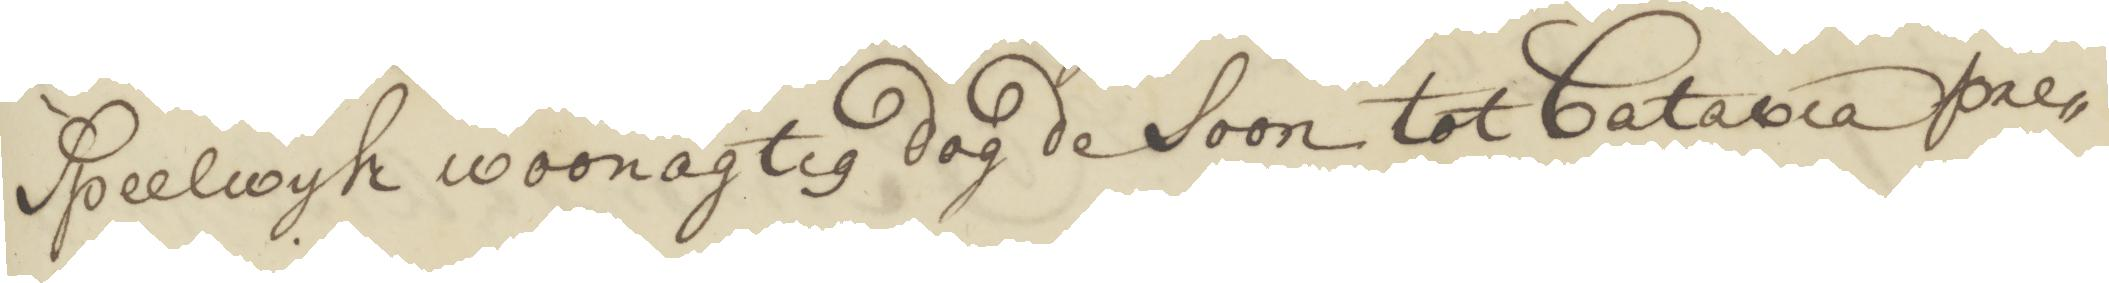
Speelwijk woonagtig dog de soon tot Batavia pre„
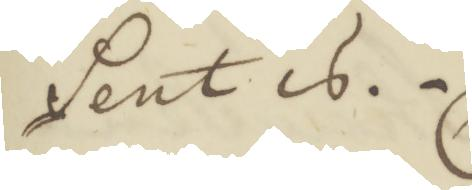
sent is. -
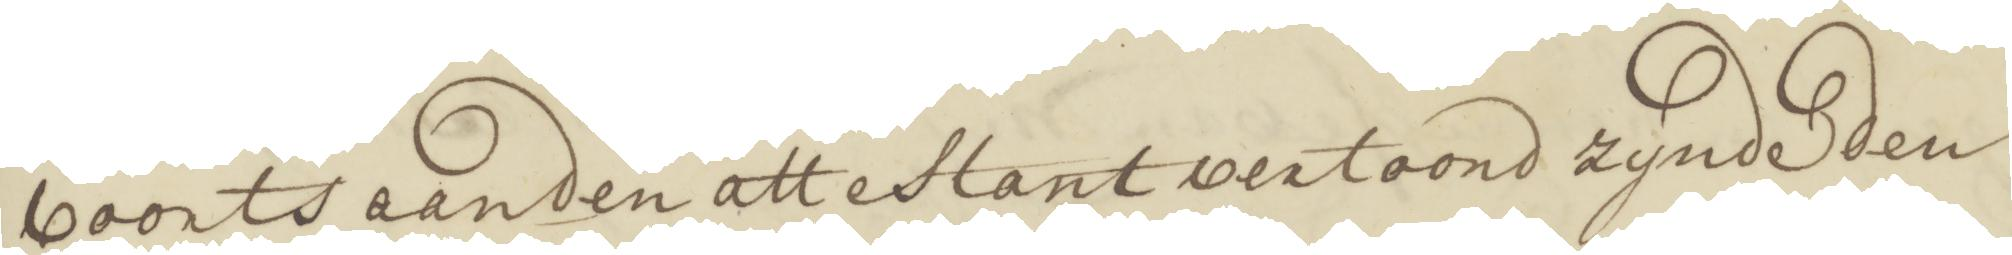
voorts aan den attestant vertoond zynde den
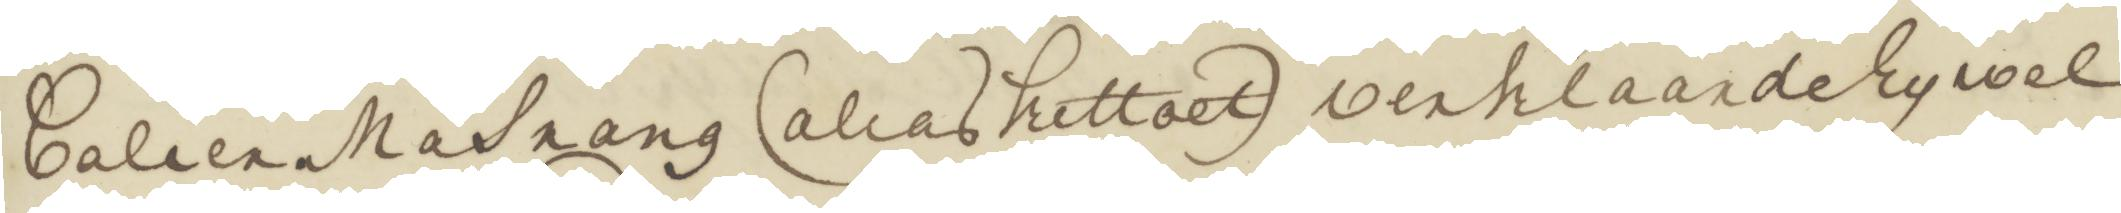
balier Masrang (alias kittoet) verklaarde hy wel
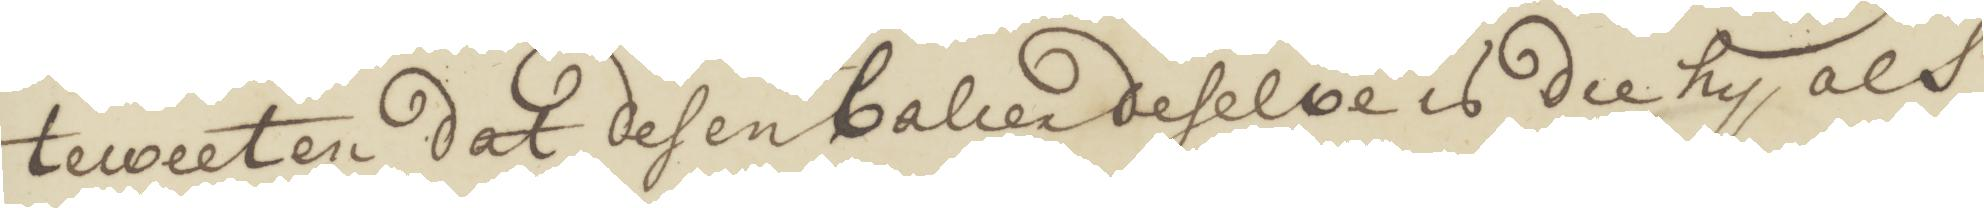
teweeten dat desen balier deselve is die hy als
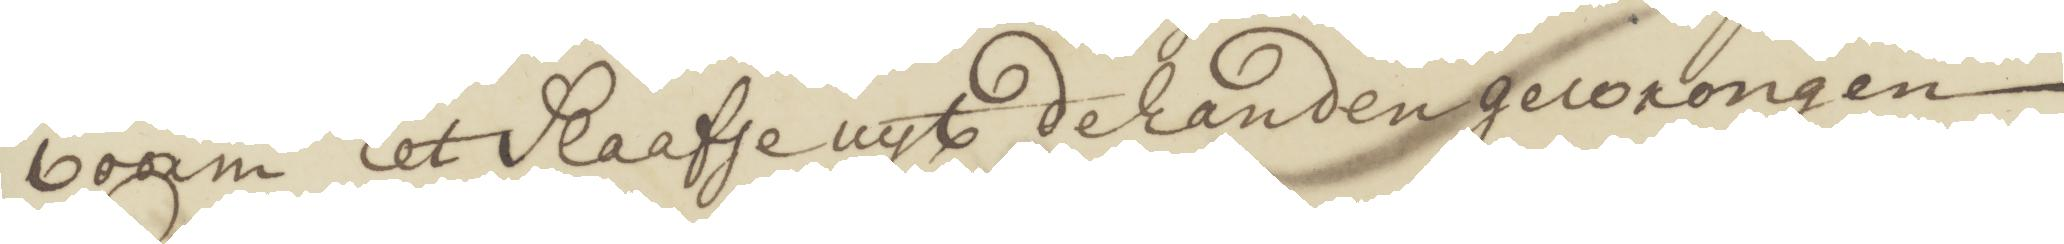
voorm het Slaafje uyt de handen gewrongen
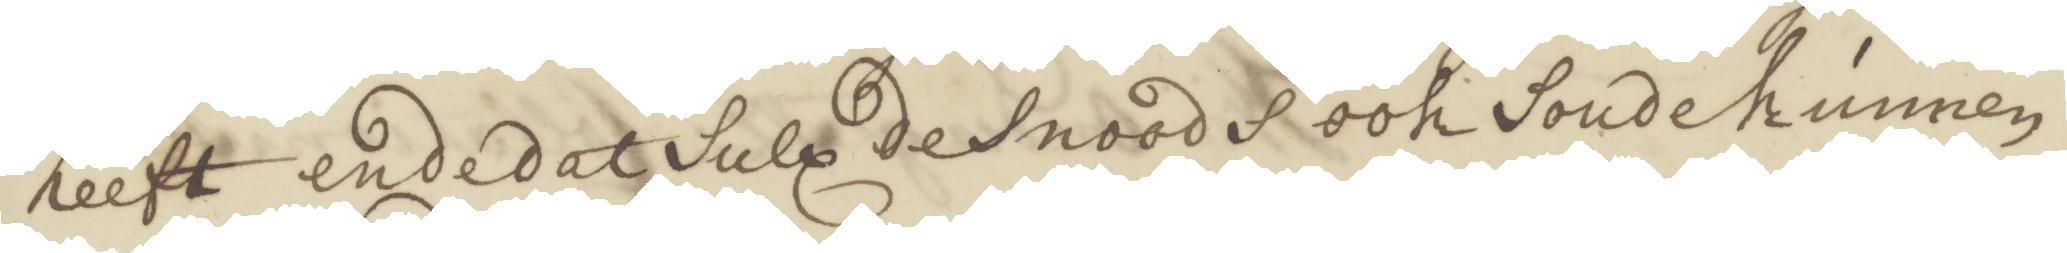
heeft ende dat sulx desnoods ook soude kunnen
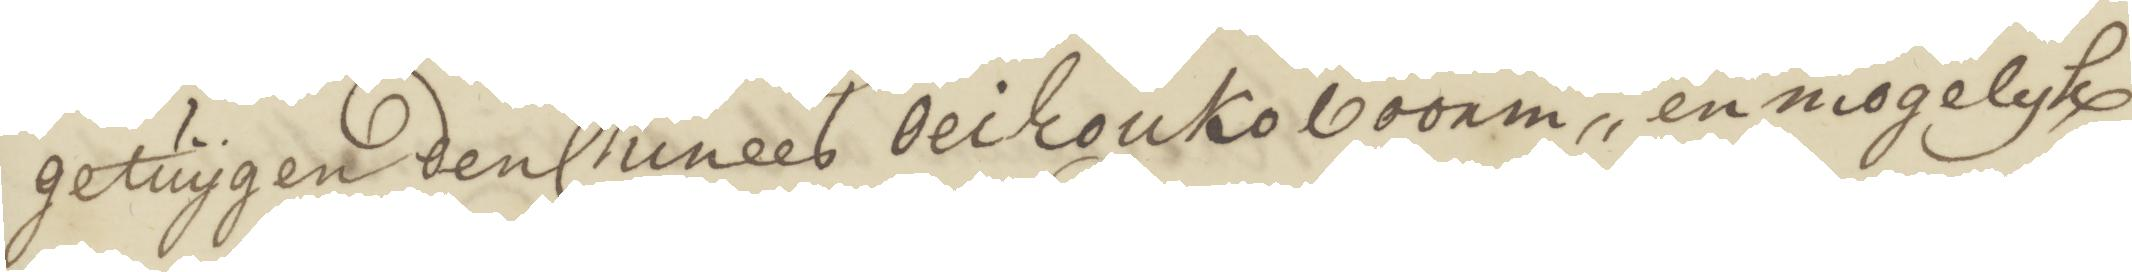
getuijgen den Chinees Oeihouko voorm„t en mogelyk
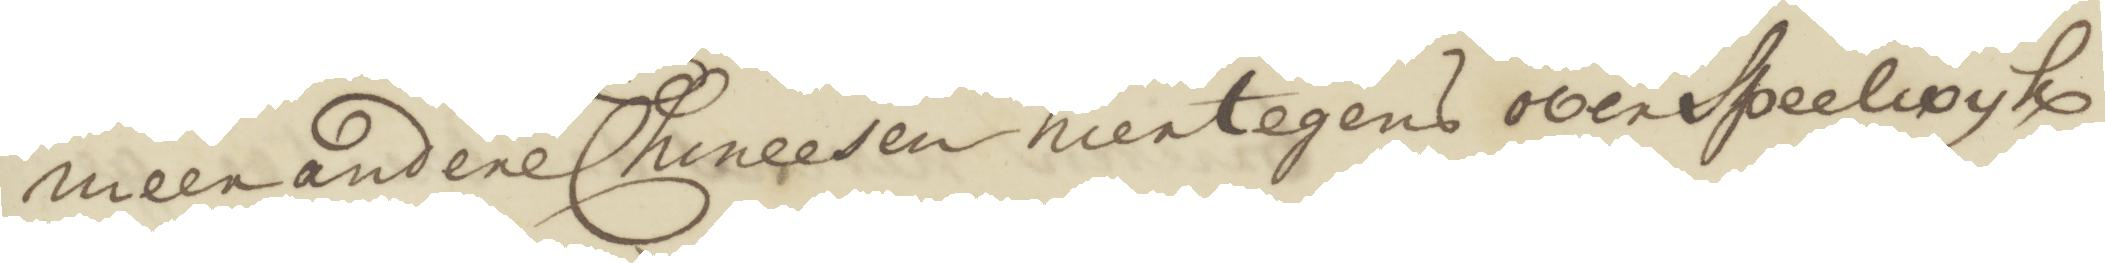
meer andere Chineesen hiertegens over speelwyk
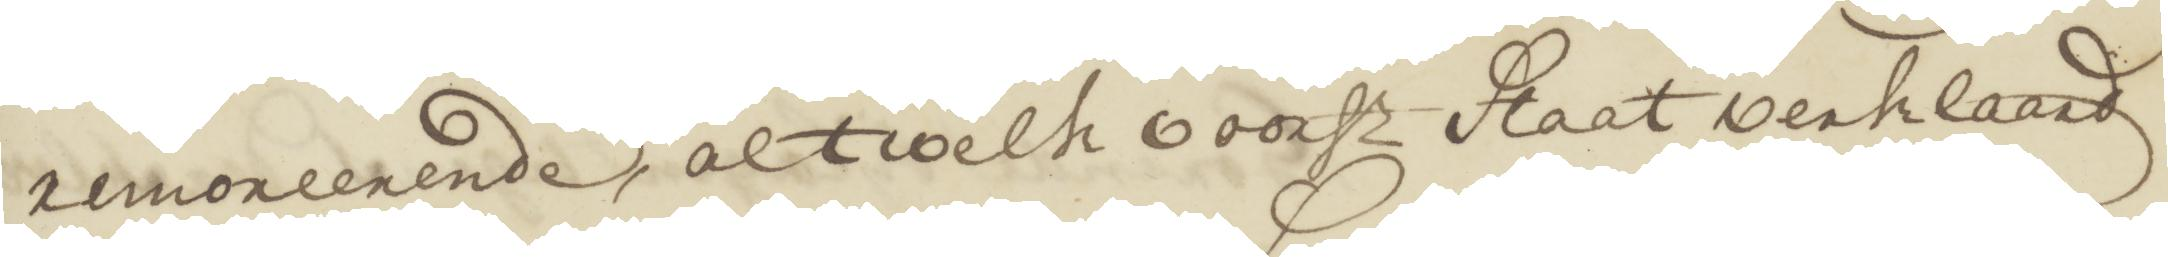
remoreerende, altwelk voorsz Staat verklaard
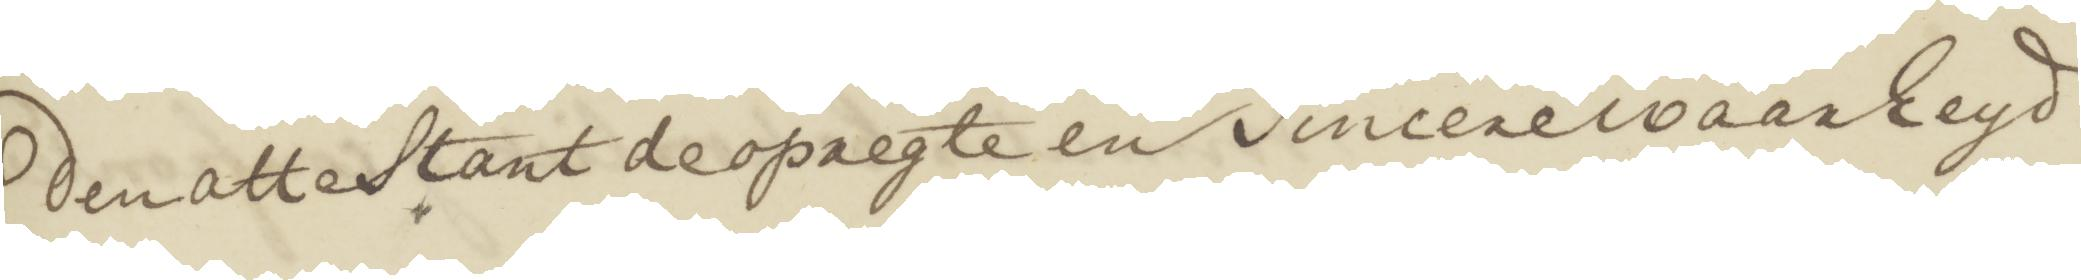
den attestant de opregte en Sincere waarheyd
